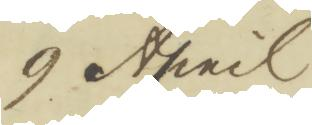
9 April
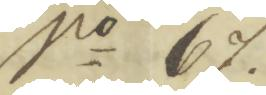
N=o 67.
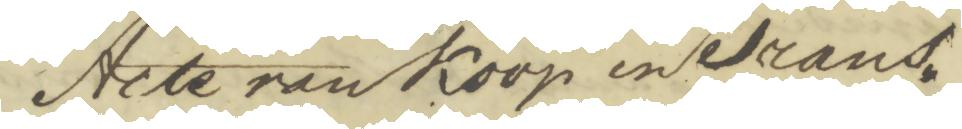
Acte van Koop en Trans„
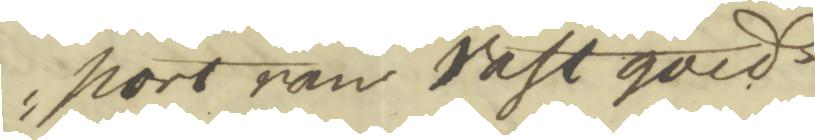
„port van Vast goed
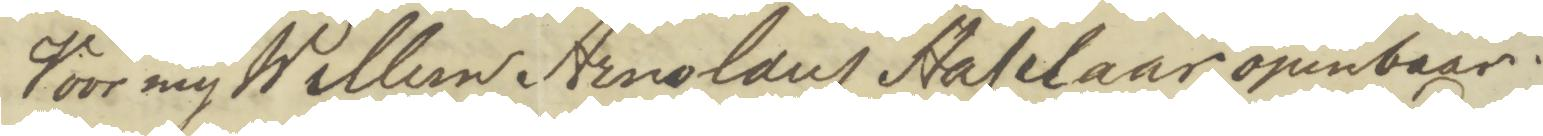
Voor my Willem Arnoldus Haselaar openbaar
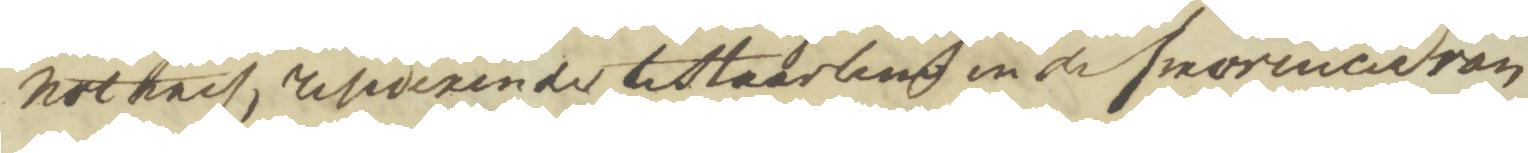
notaris, residerende te Haarlem in de provincie van
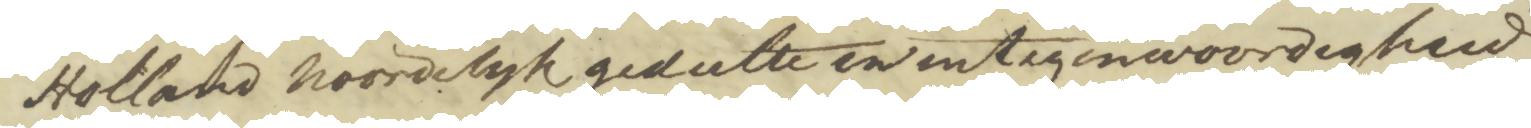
Holland noordelyk gedeelte en integenwoordigheid
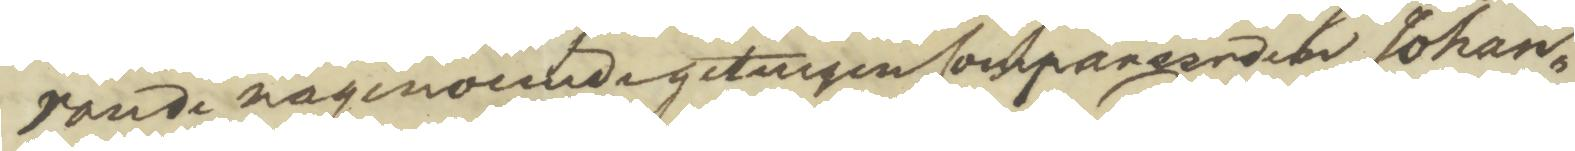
van de nagenoemde getuigen Compareerden Johan„
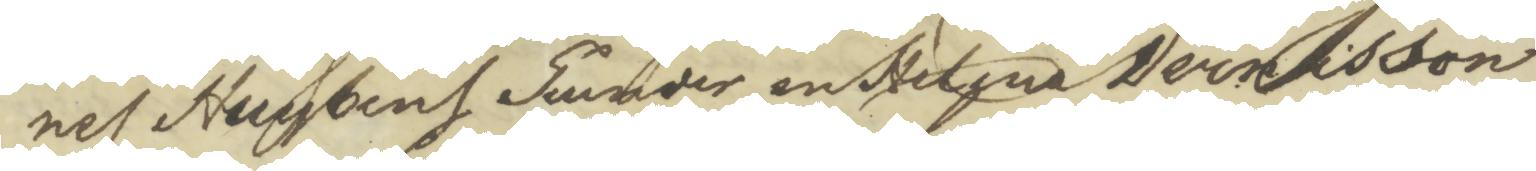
nes Huybens Tuinder en Helena Dernisson
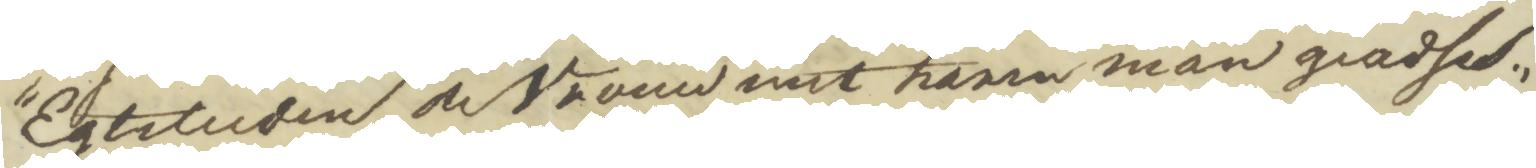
Egtslieden, de Vrouw met haren man geadsis„
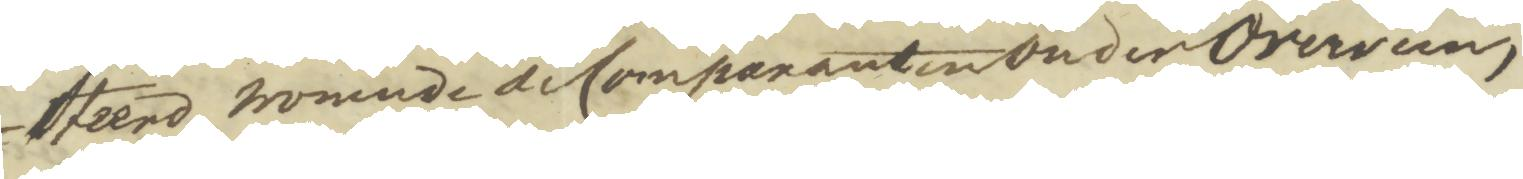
=steerd, wonende de Comparanten onder Overveen,
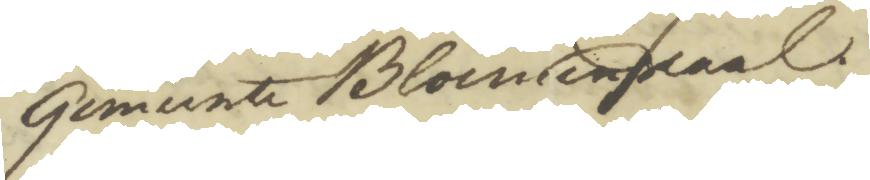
Gemeente Bloemendaal.
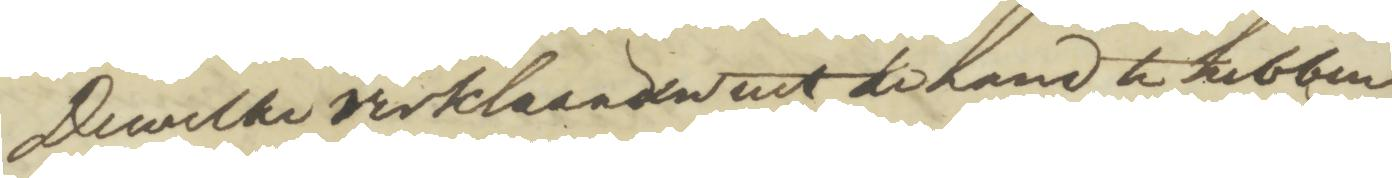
Dewelke verklaarden uit de hand te hebben
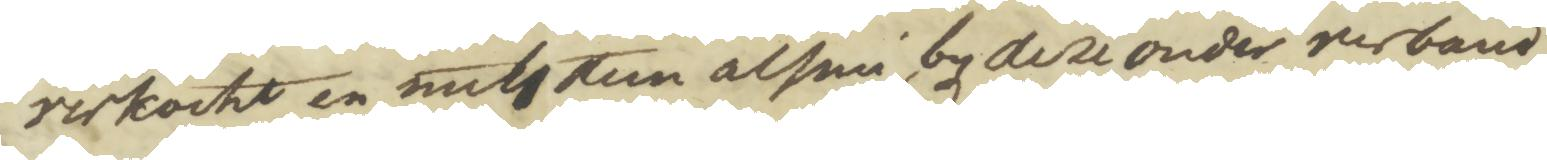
verkocht en mitsdien alhier by deze onder verband
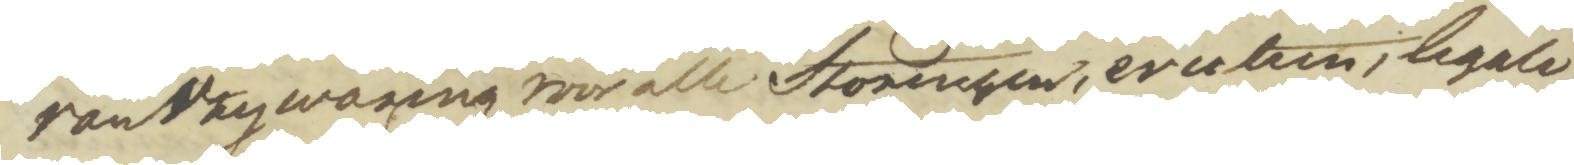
van Vrywaring voor alle storingen, evictien, legale
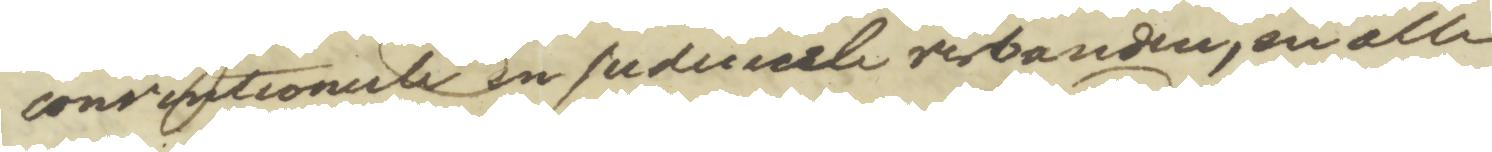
conventioneele en judicieele verbanden, en alle
